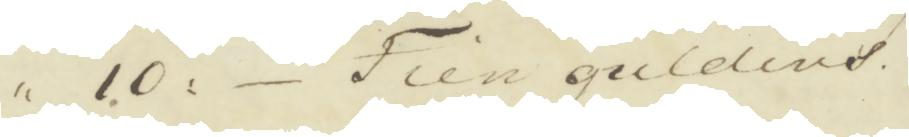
„ 10:— Tien guldens.
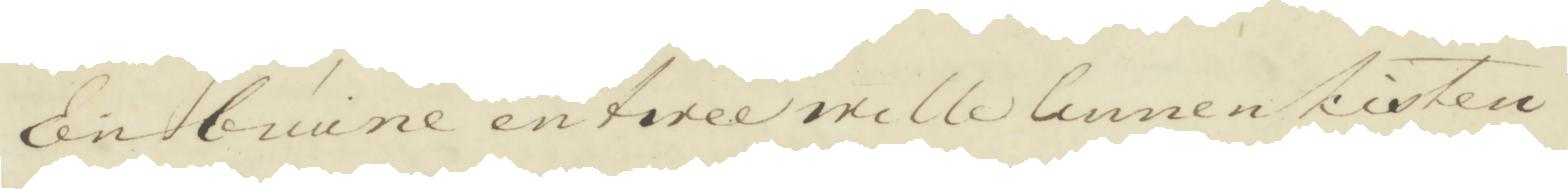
Een bruine en twee witte linnen kisten
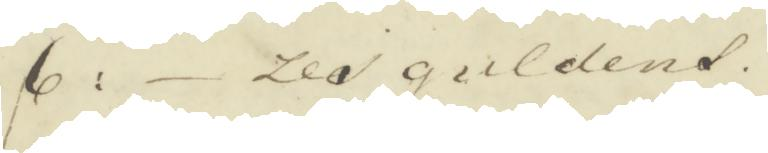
6: — zes guldens.
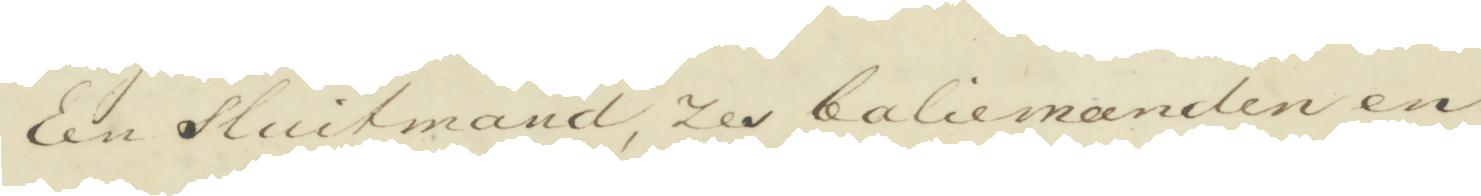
Een sluitmand, zes baliemanden en
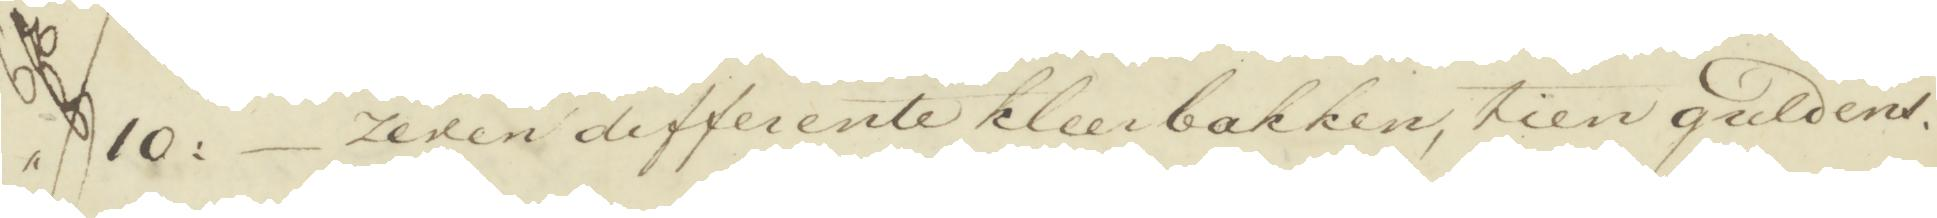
„ 10: — zeven differente kleerbakken, tien guldens.
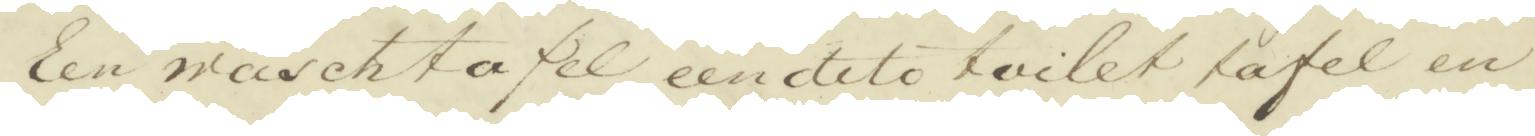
Een waschtafel, een dito toilet tafel en
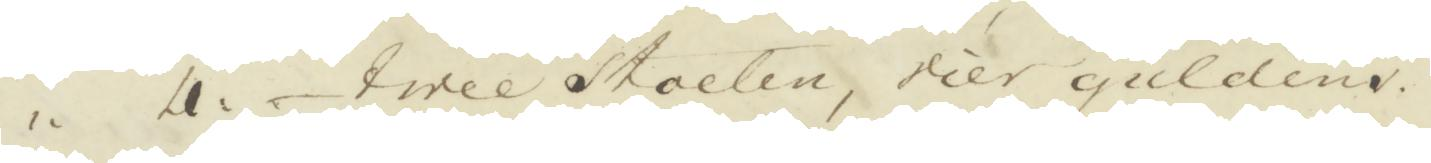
„ 4: — twee stoelen, vier guldens.
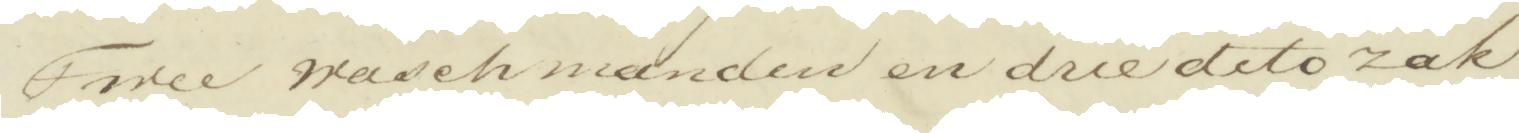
Twee waschmanden en drie dito zak
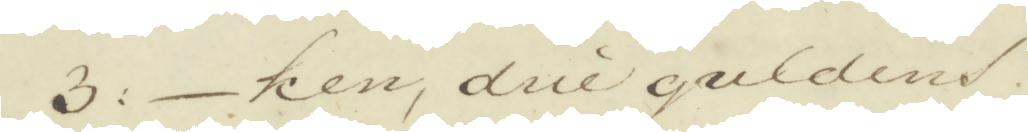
3:— ken, drie guldens.
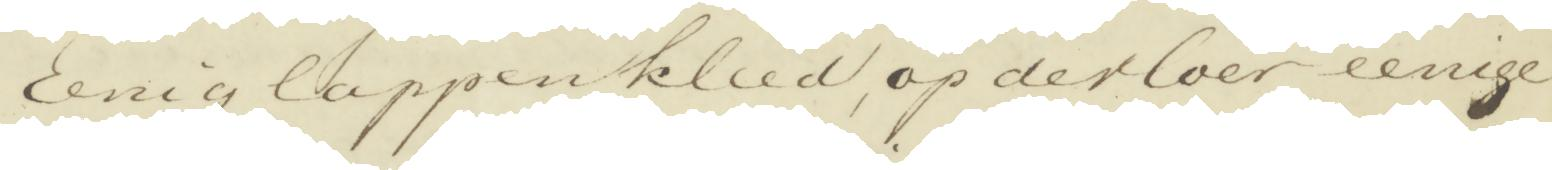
Eenig lappenkleed, op devloer eenige
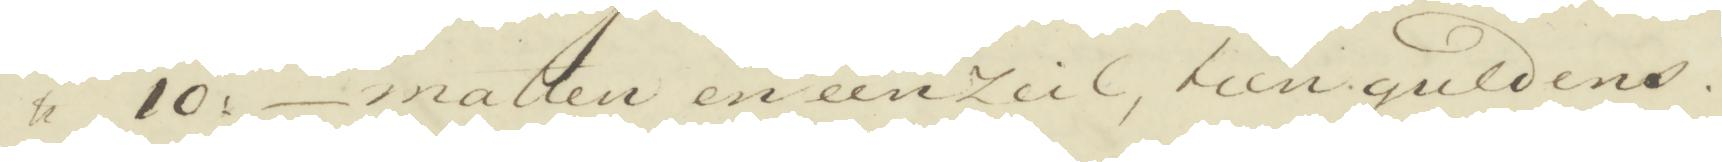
10: — matten en een zeil, tien guldens.
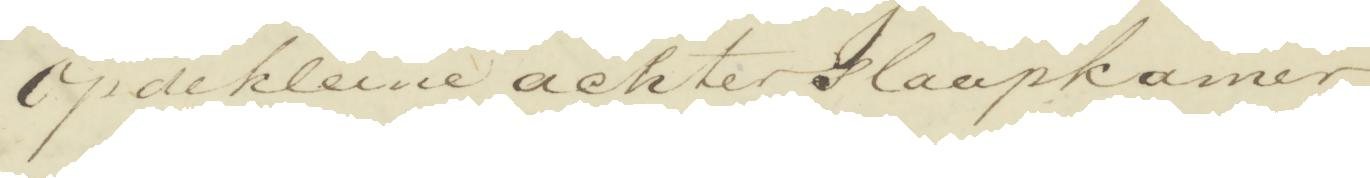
Op de kleine achter slaapkamer
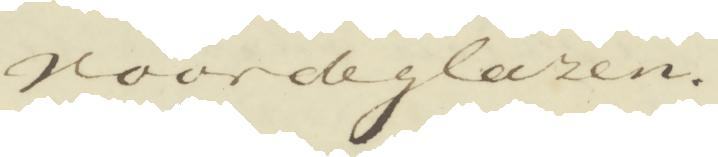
voorde glazen.
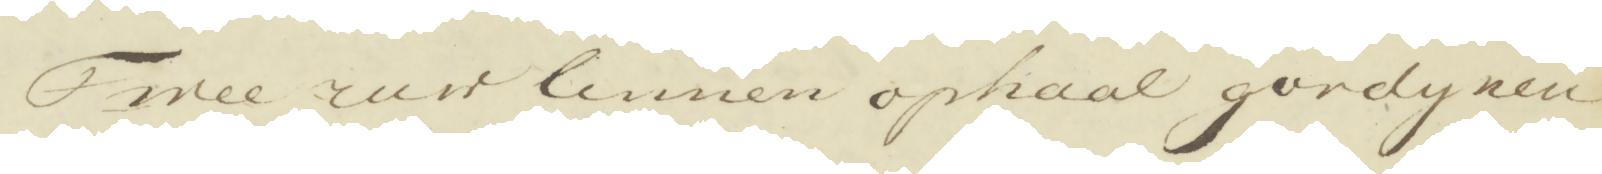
Twee ruw linnen ophaal gordynen
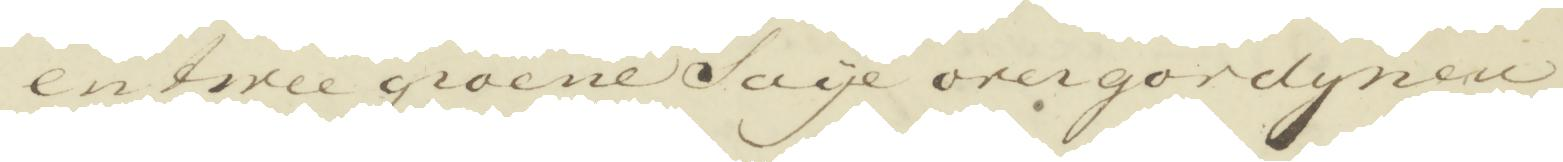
en twee groene Saije overgordynen
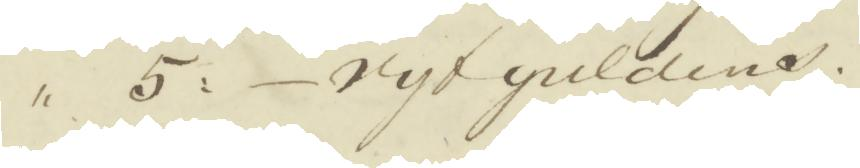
„ 5: — vyf guldens.
